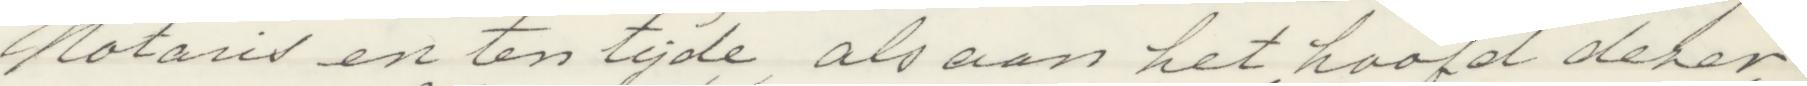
Notaris en ten tijde, als aan het hoofd dezer
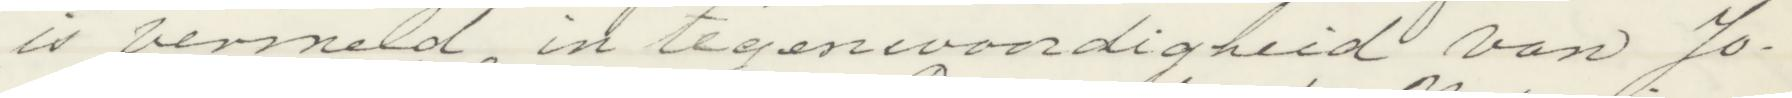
is vermeld, in tegenwoordigheid van Jo-
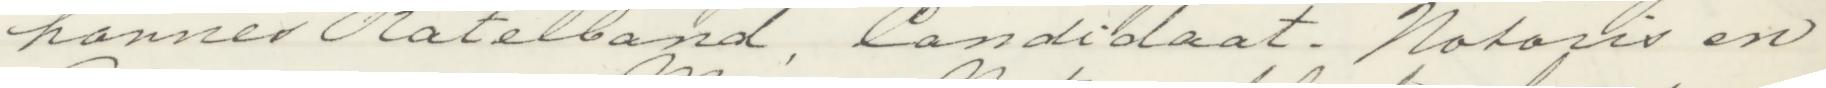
hannes Ratelband, Candidaat- Notaris en
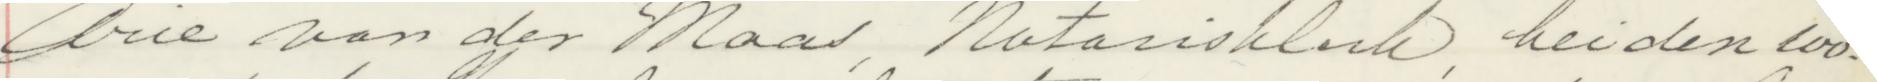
Arie van der Maas, Notarisklerk, beiden wo-
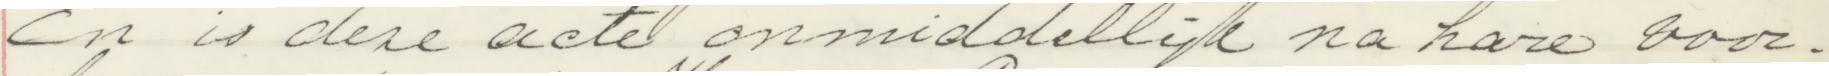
En is deze acte onmiddellijk na hare voor-
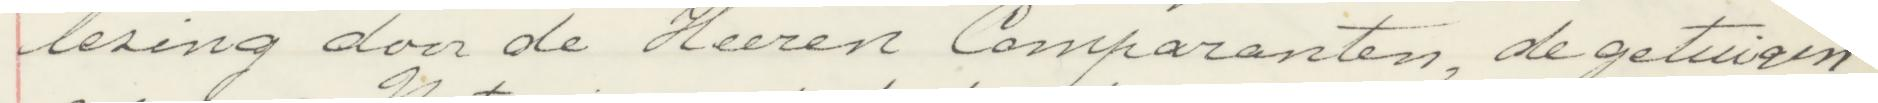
lezing door de Heeren Comparanten, de getuigen
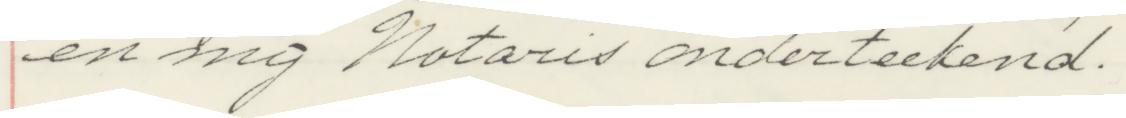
en mij Notaris onderteekend.
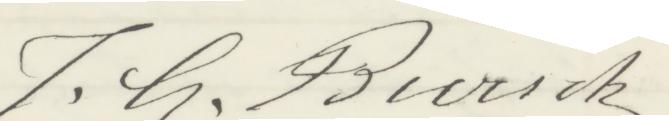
J.G. Bursch
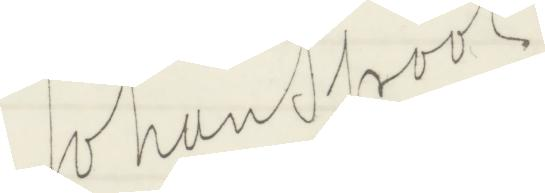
Johanspoor
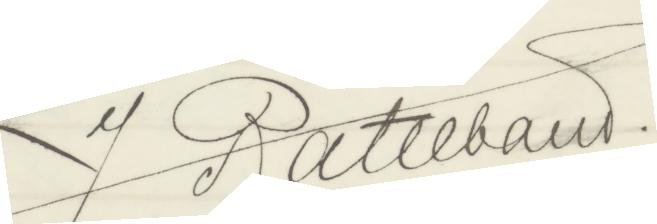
J Ratelband.
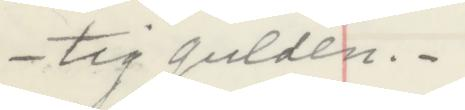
-tig gulden.-
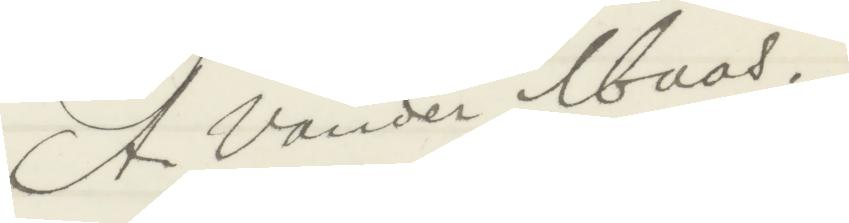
A vander Maas.
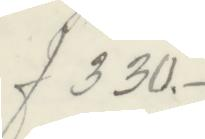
ƒ 330.—
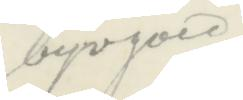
byv goed
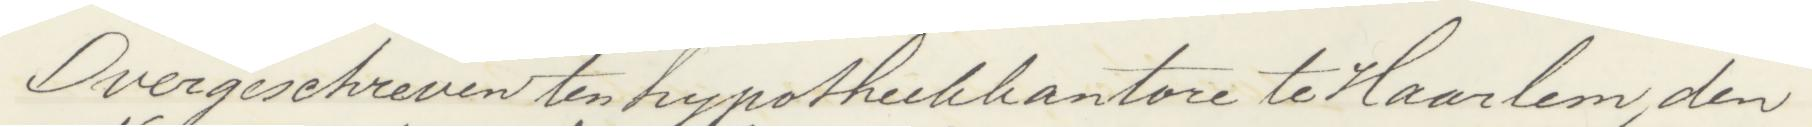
Overgeschreven ten hypotheekkantore te Haarlem, den
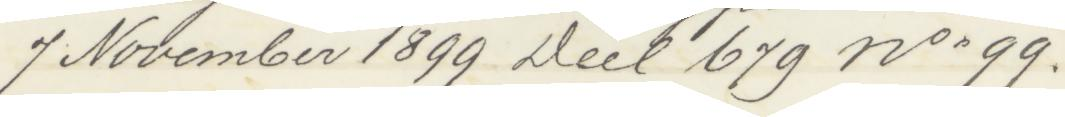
7 November 1899 Deel 679 n=o 99.
